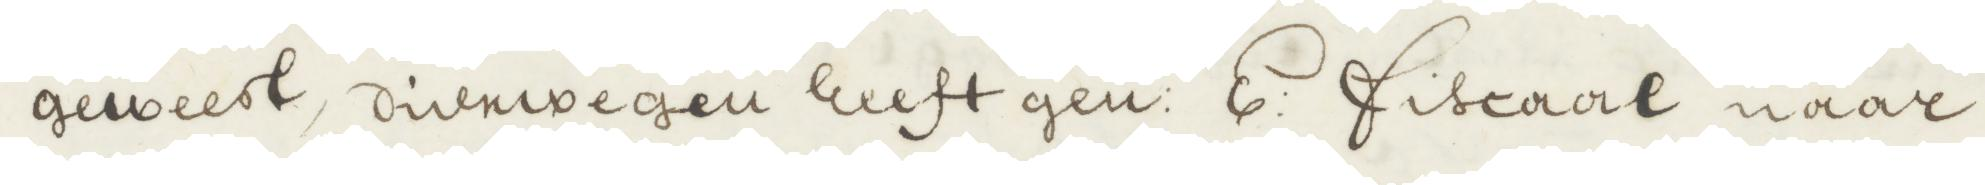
geweest, dierwegen heeft gen: E: fiscaal naar
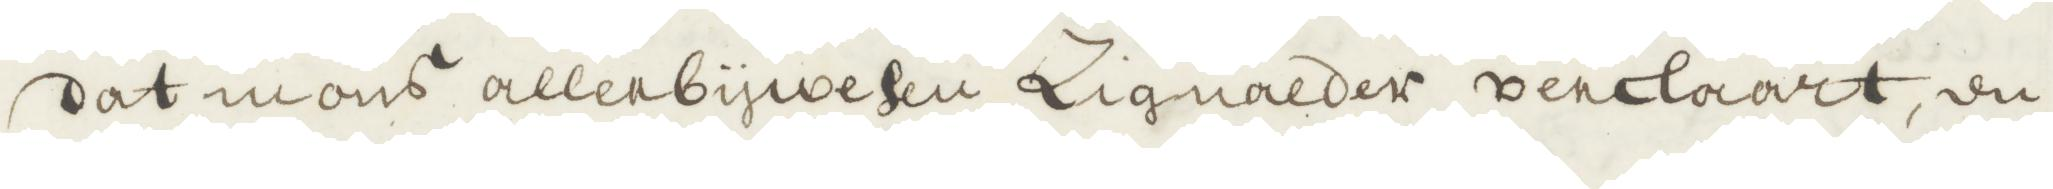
dat in ons aller bijwesen zig naeder verclaart, en
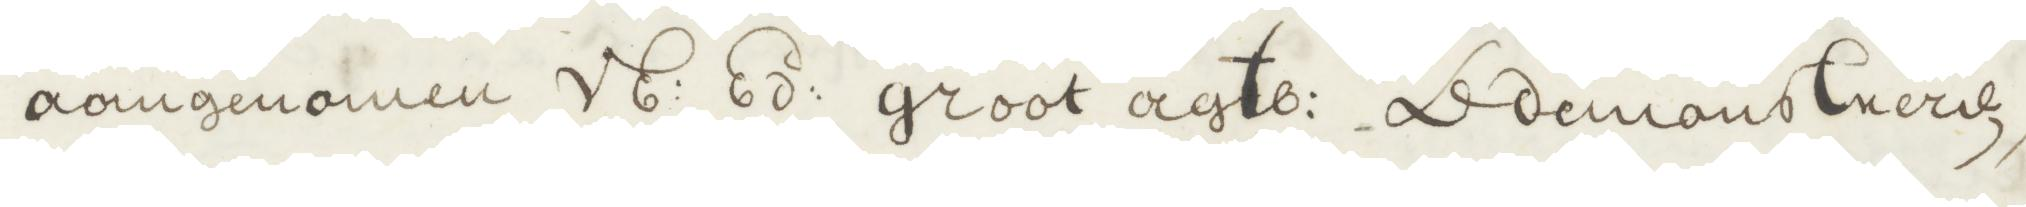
aangenomen UE: Ed: groot agtb: te demonstreren,
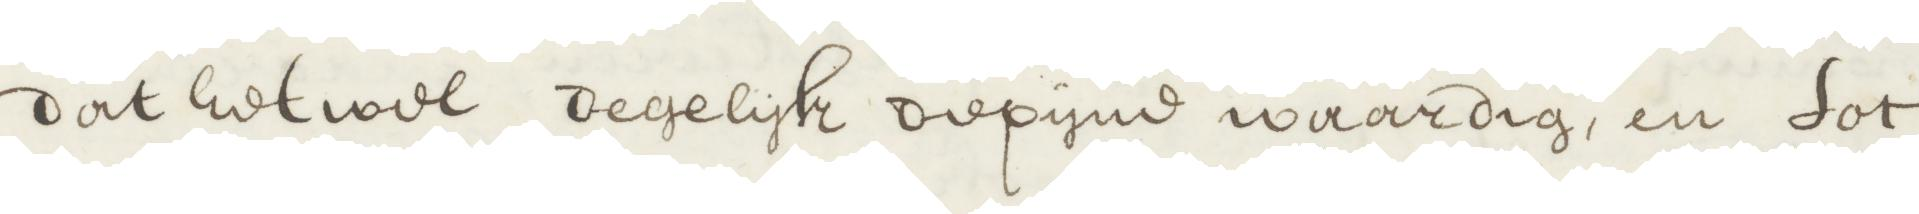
dat het wel degelijk de pijne waardig, en tot
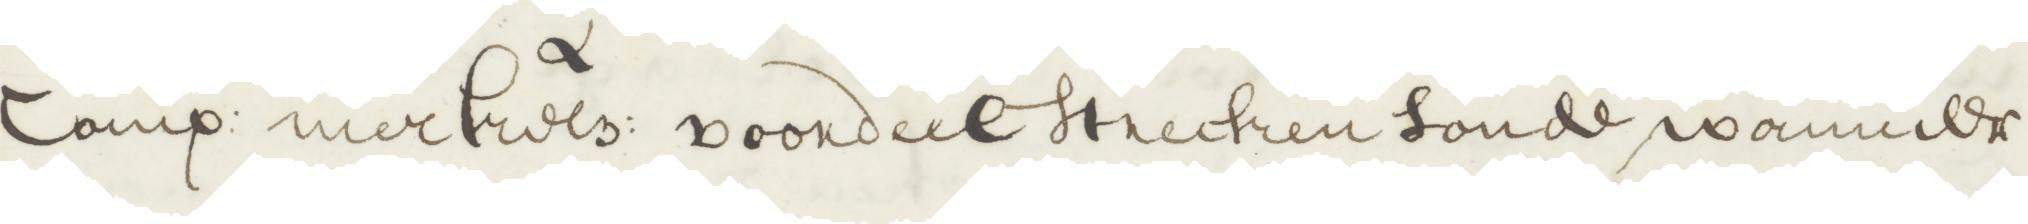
Comp: merkelijk voordeel strecken soude wanneer
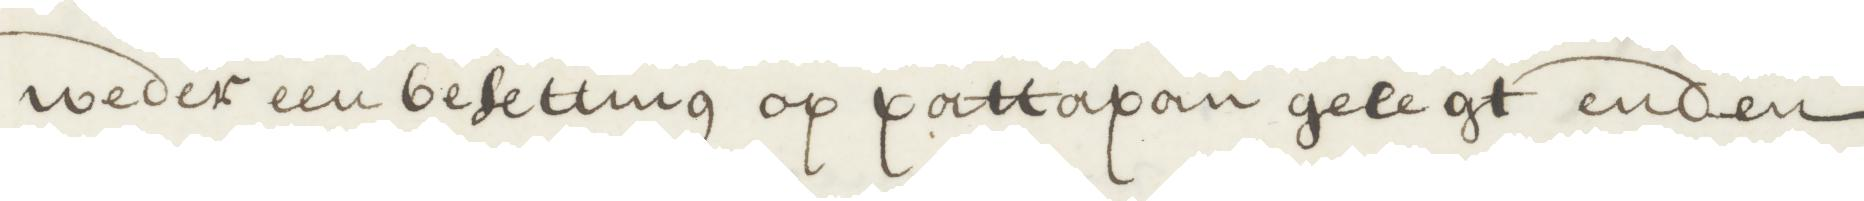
weder een besetting op pattapan gelegt en den
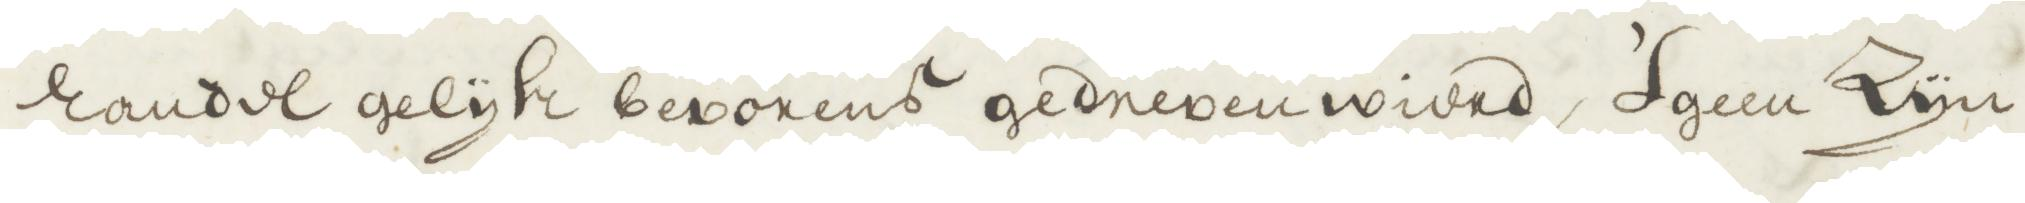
handel gelijk bevorens gedreven wierd, 't geen zijn
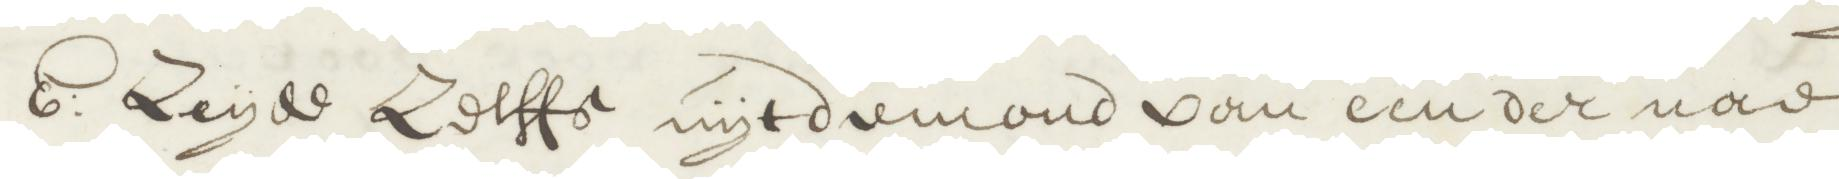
E: zeijde zelffs uijt de mond van een der nae
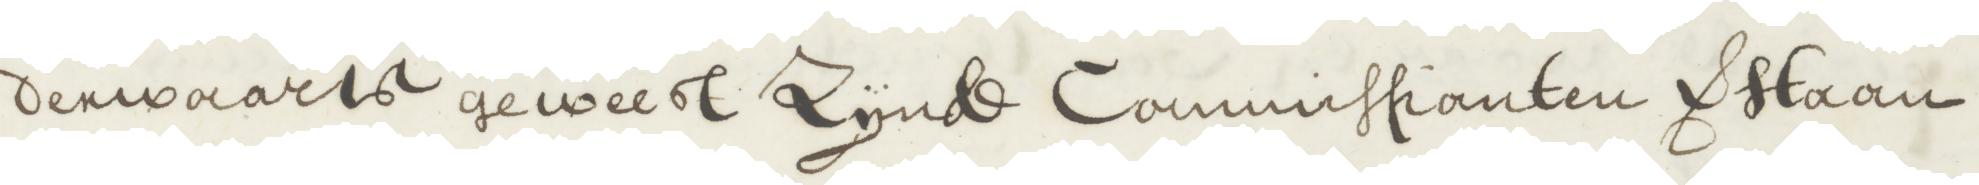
derwaarts geweest zijnde Commissianten verstaan
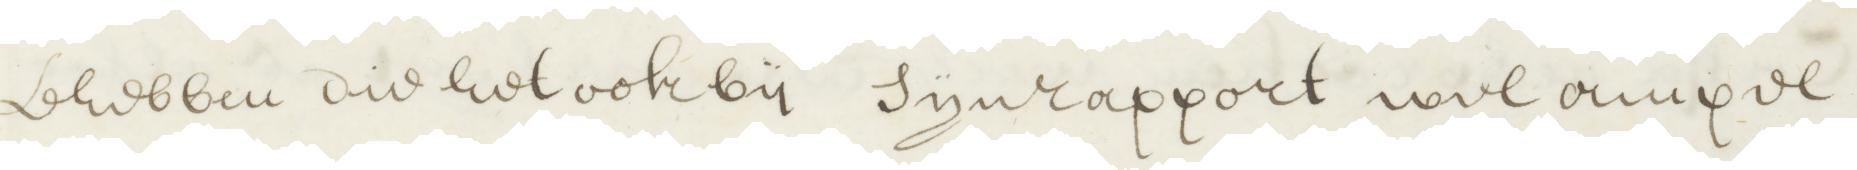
te hebben die het ook bij sijn rapport wel ampel
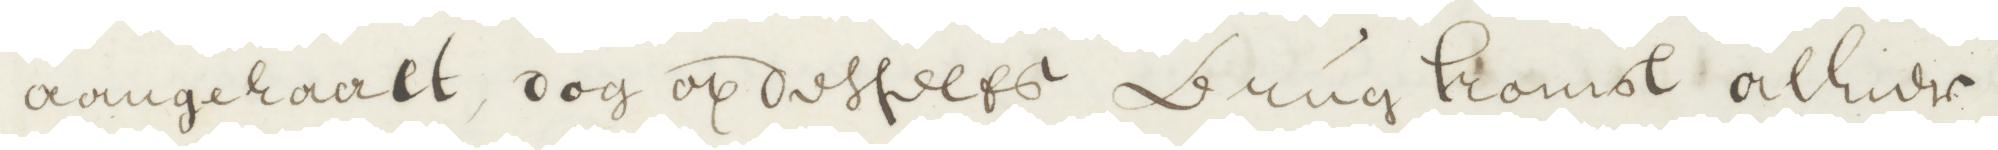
aangehaalt, dog op desselfs te rug komst alhier
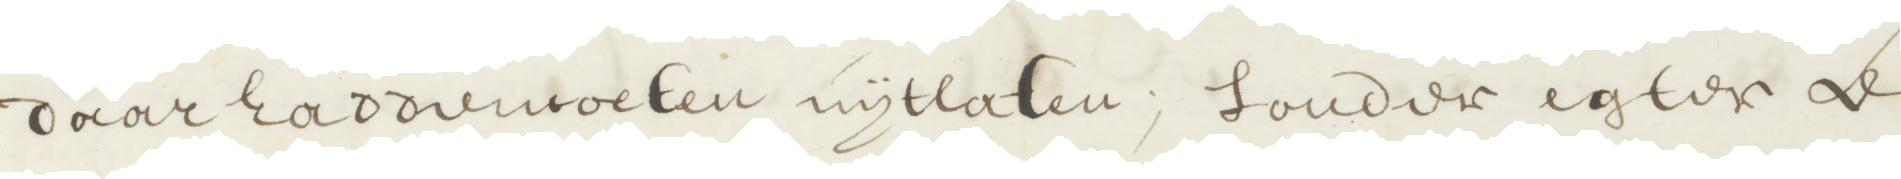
daar hadde moeten uijtlaten; sonder egter te
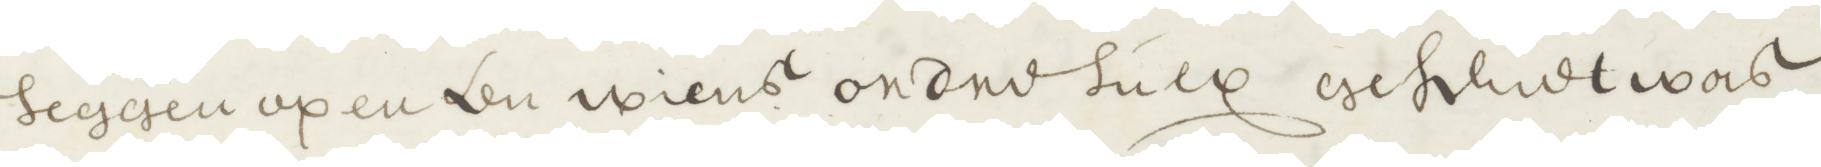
seggen op en ten wiens ordre sulx geschiet was,
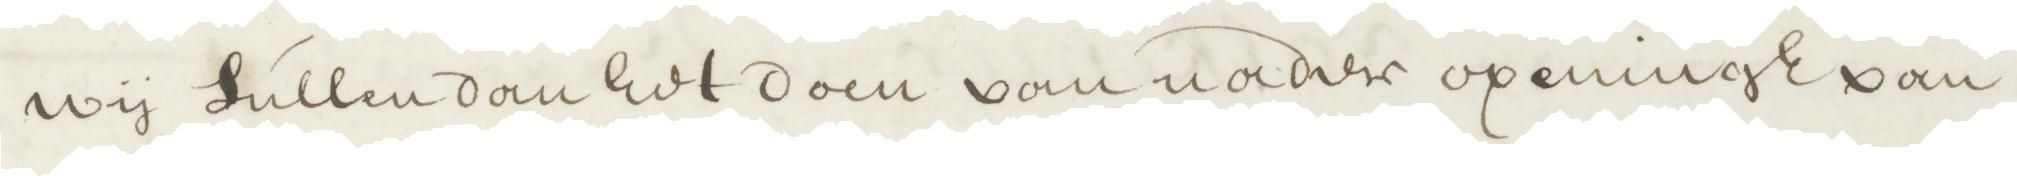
wij sullen dan het doen van nader openingh van
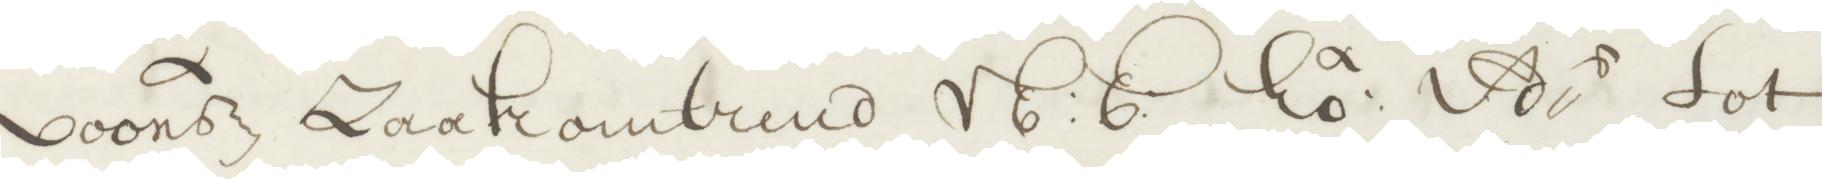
voorsz zaak omtrend UE: E: ho: Ed„s tot
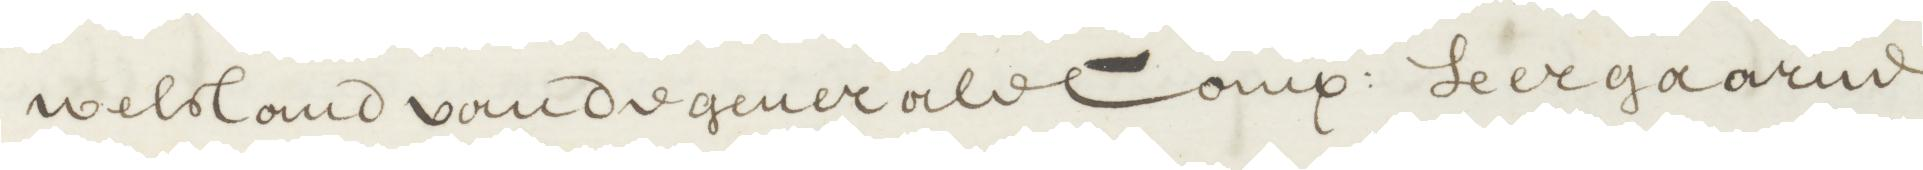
welstand van de generale Comp: seer gaarne
